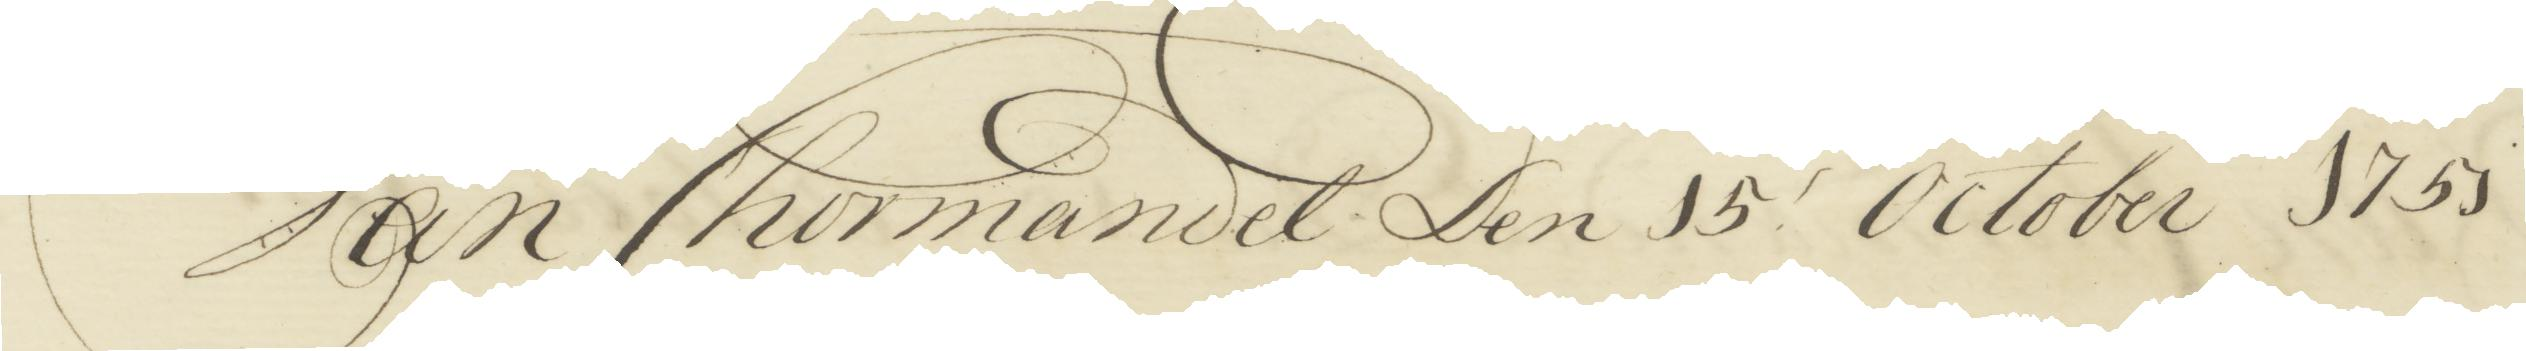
Van Chormandel Den 15:' October 1751
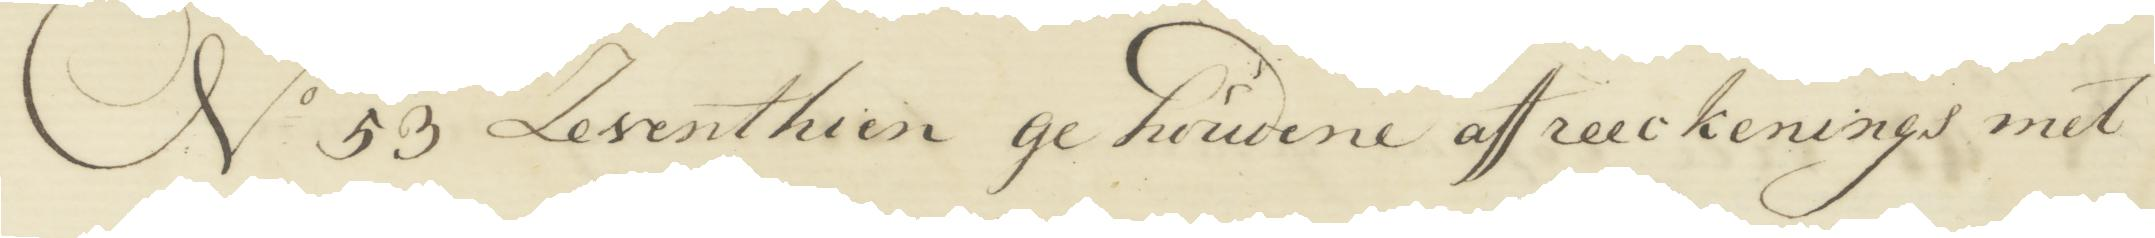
N:o 53 Zeventhien gehoudene affreeckenings met
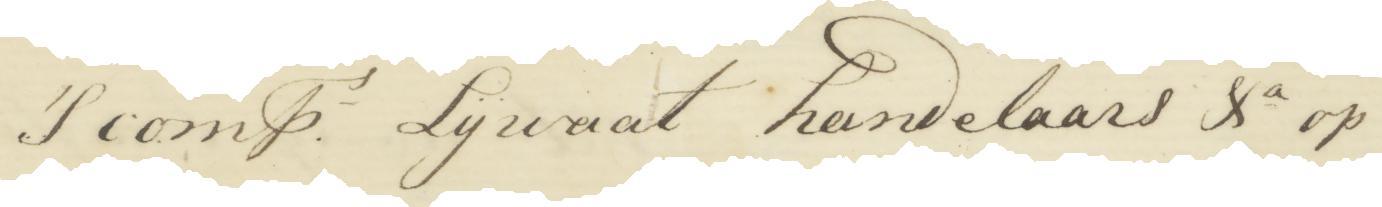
’s comp:s Lijwaat handelaars &=a op
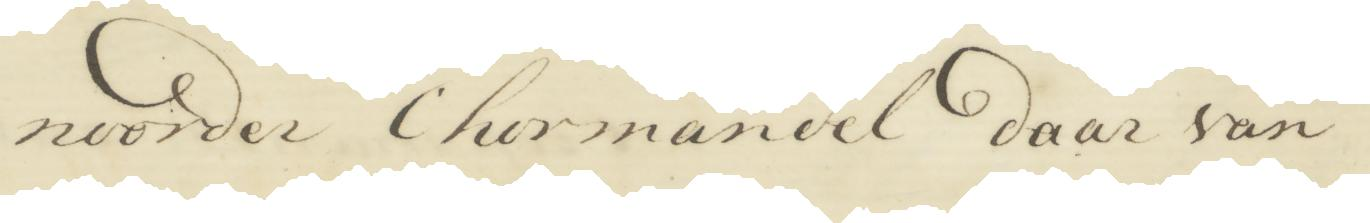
noorder Chormandel daar van
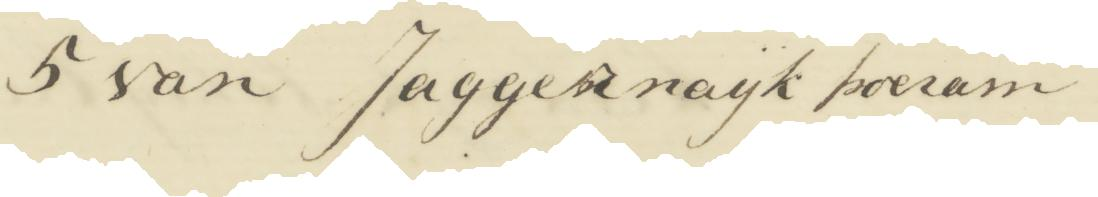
5 van Jaggernaijk poeram
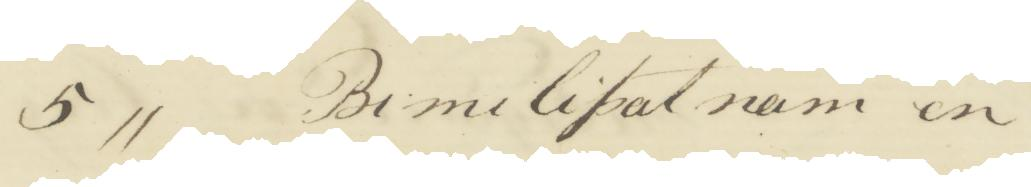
5 „ Bimilipatnam en
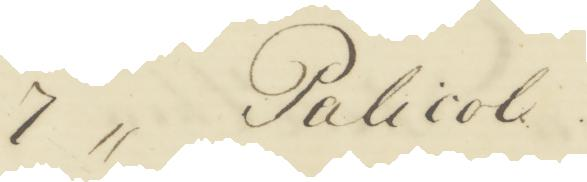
7 „ Palicol
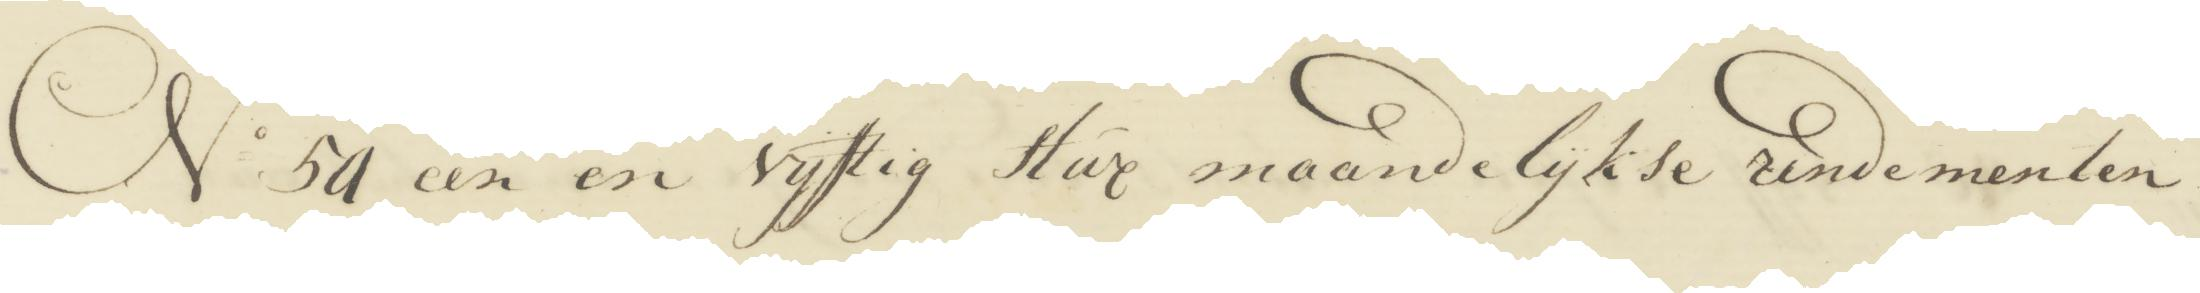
N:o 54 een en vijftig stux maandelijkse rendementen
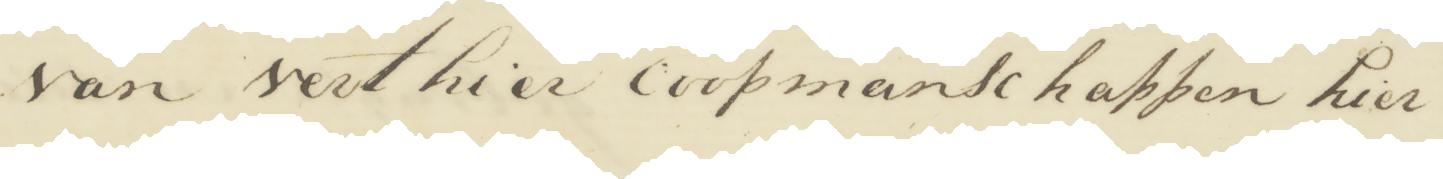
van verthier coopmanschappen hier
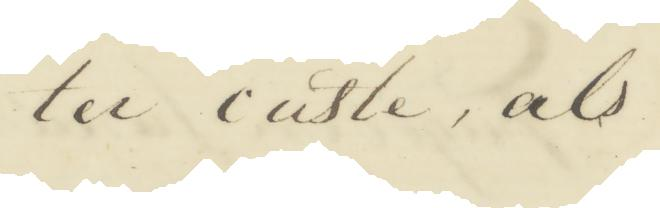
ter custe, als
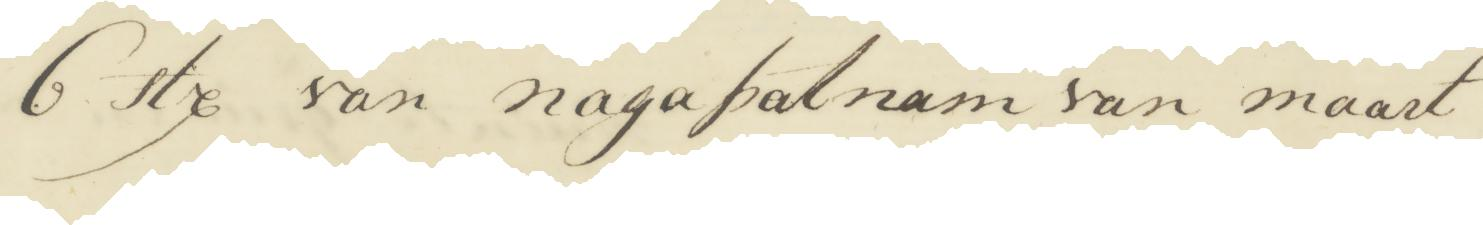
6 stx van nagapatnam van maart
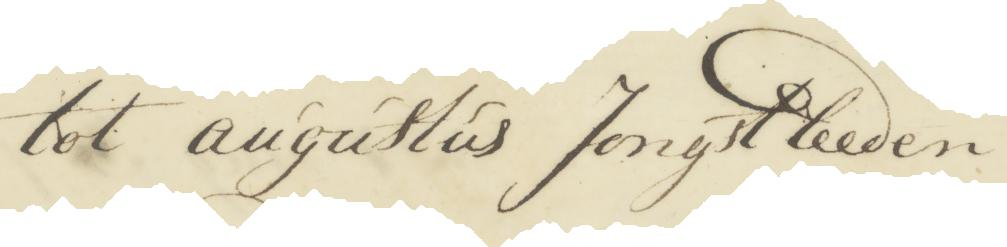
tot augustus Jongstleeden
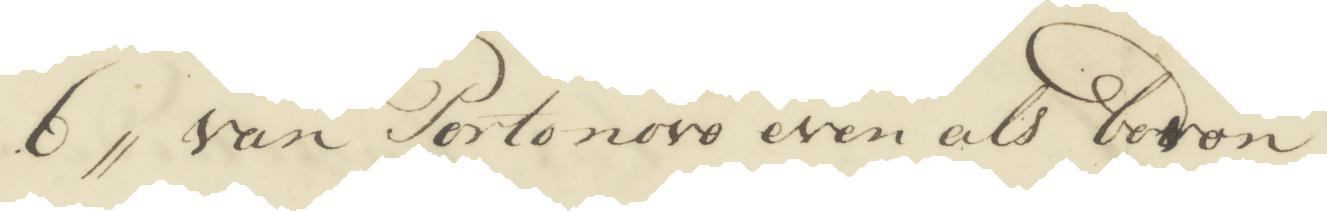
6 „ van Portonovo even als boven
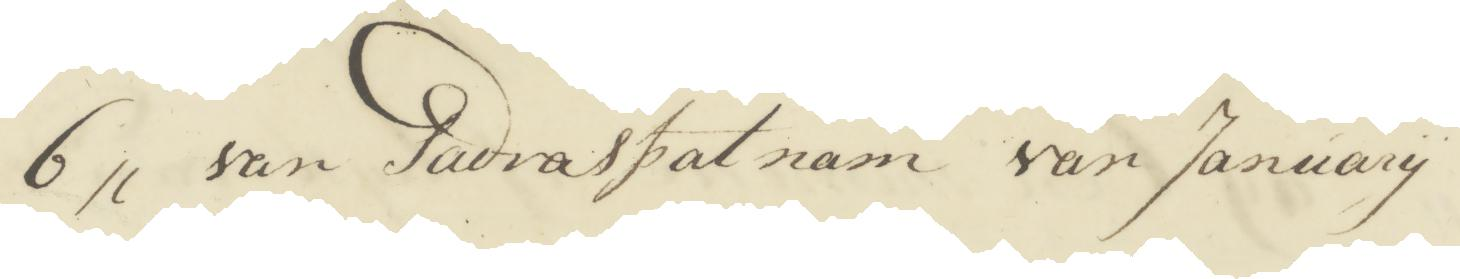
6 „ van Sadraspatnam van Januarij
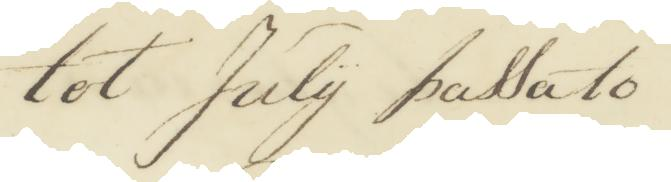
tot Julij passato
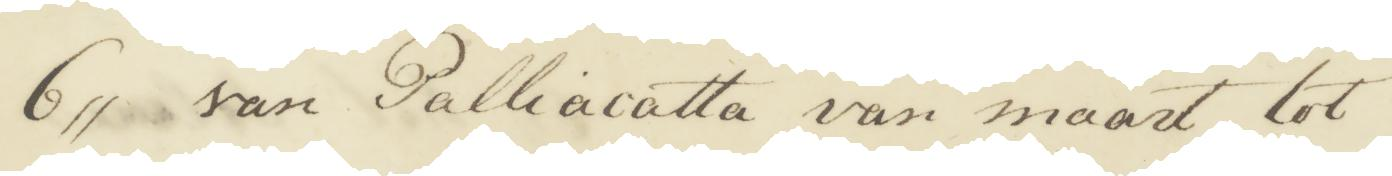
6 „ van Palliacatta van maart tot
